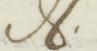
A:
